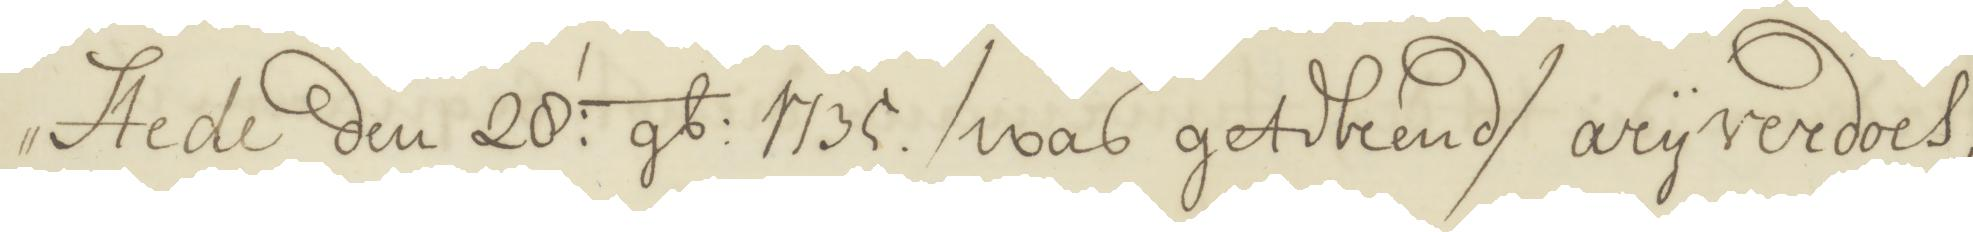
stede den 28:' 9b: 1735. /was getekend/ arij verdoes,
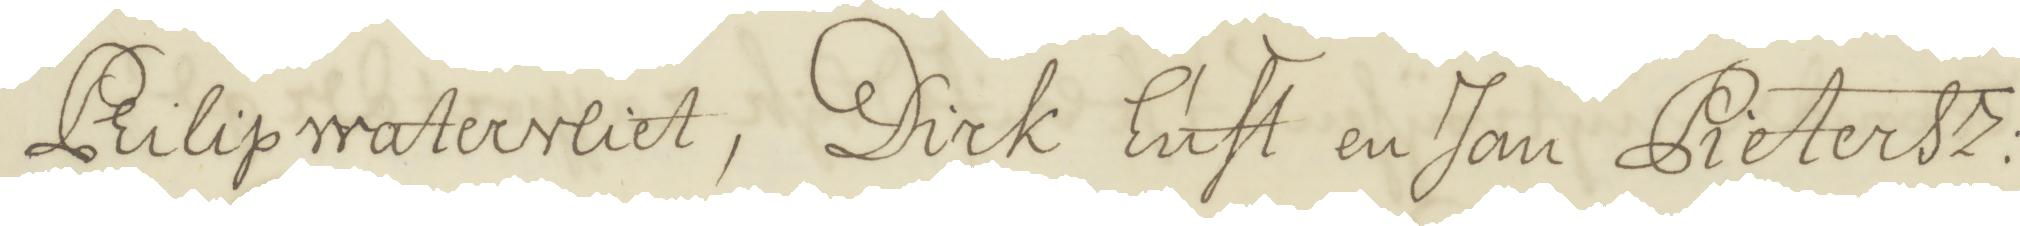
Philip watervliet, Dirk huft en Jan Pietersz:
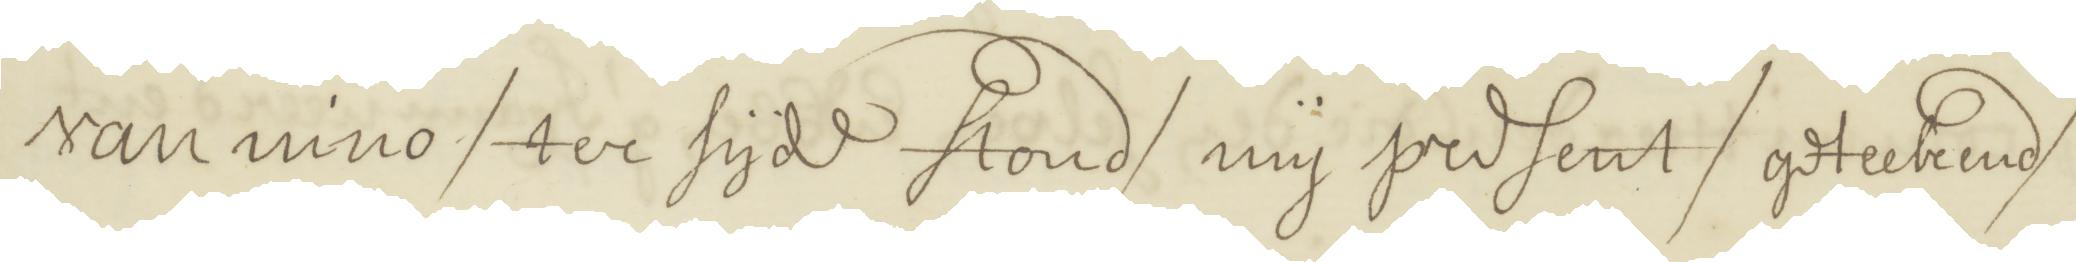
van nino /ter sijde stond/ mij present /geteekend/
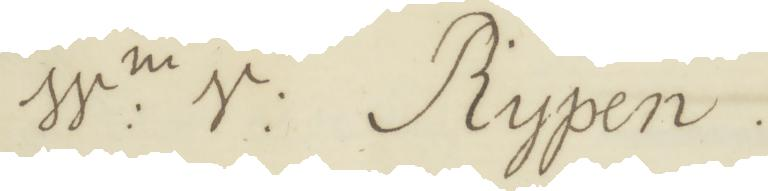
W:m V:n Rijpen. —
